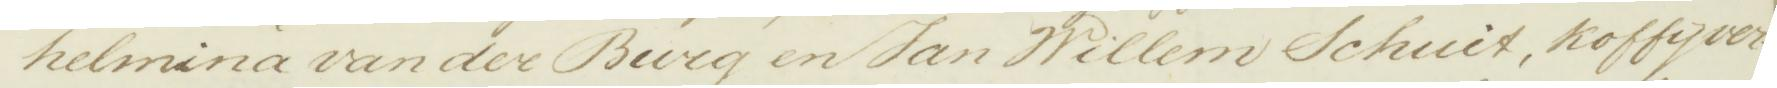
helmina van der Burg en Ian Willem Schuit, koffijver-
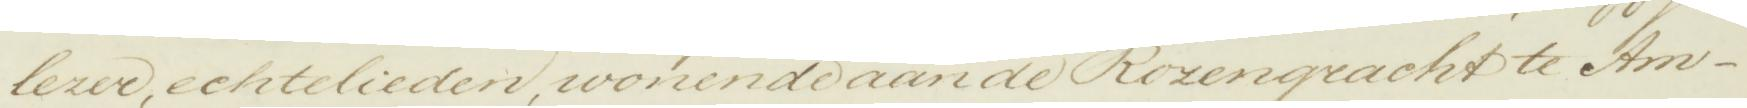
lezer, echtelieden, wonende aan de Rozengracht te Am-
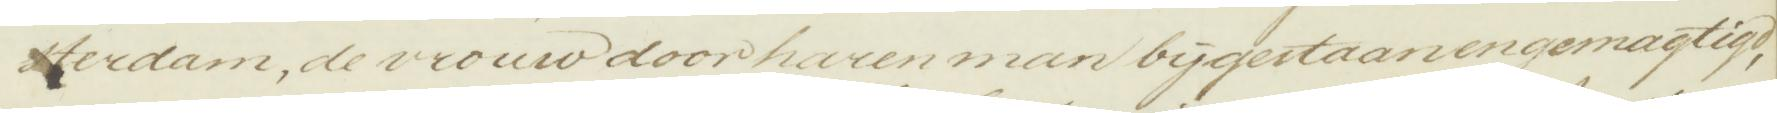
sterdam, de vrouw door haren man bij gestaan en gemagtigd,
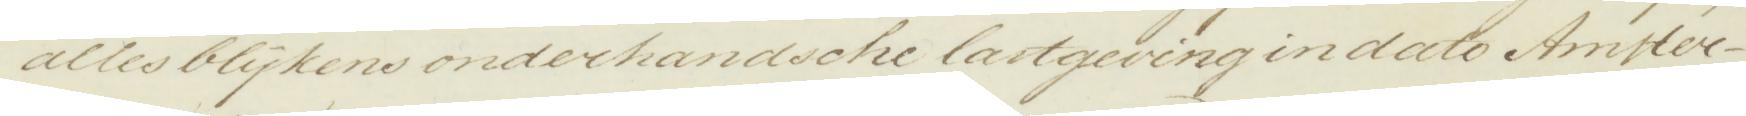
alles blijkens onderhandsche lastgeving in dato Amster-
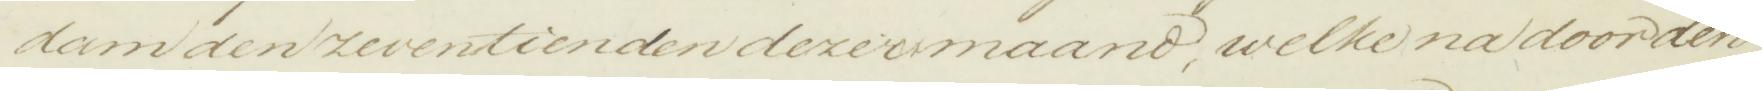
dam den zeventienden dezer maand, welke na door den
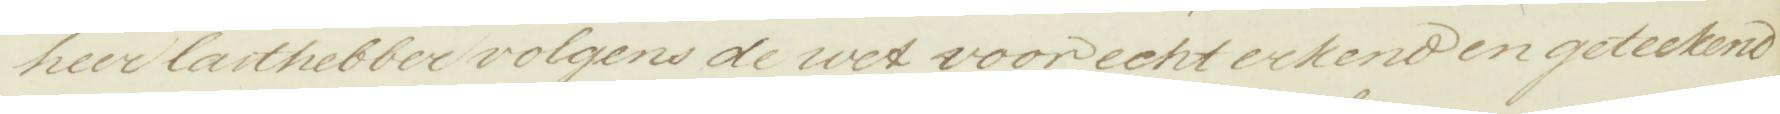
heer lasthebber volgens de wet voor echt erkend en geteekend
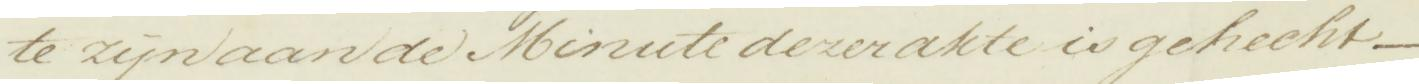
te zijn aan de Minute dezer akte is gehecht—
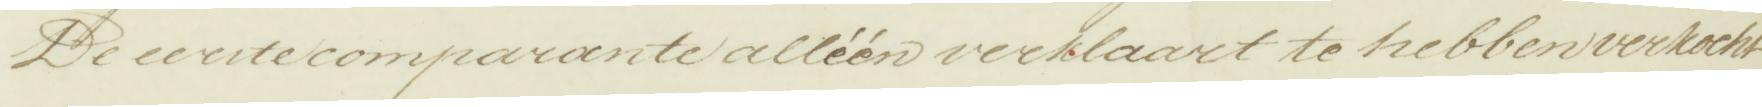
De eerste comparante alléén verklaart te hebben verkocht
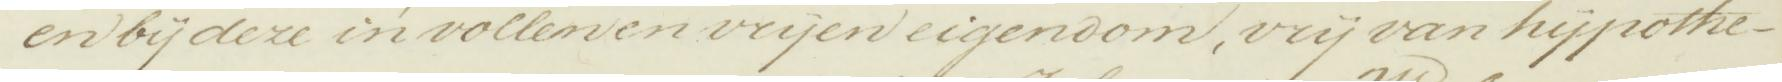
en bij deze in vollen en vrijen eigendom, vrij van hijpothe-
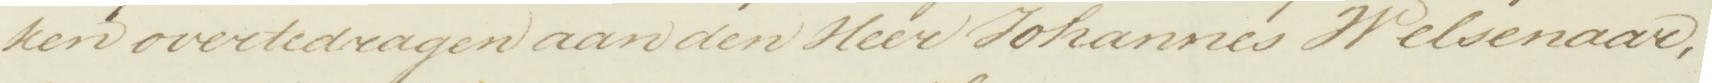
ken overtedragen aan den Heer Iohannes Welsenaar,
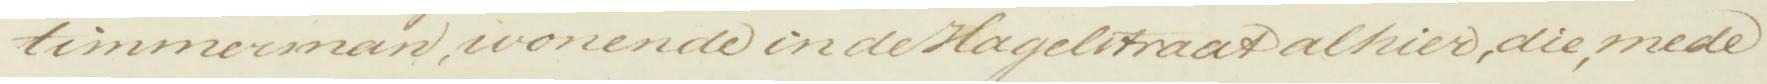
timmerman, wonende in de Hagelstraat alhier, die, mede
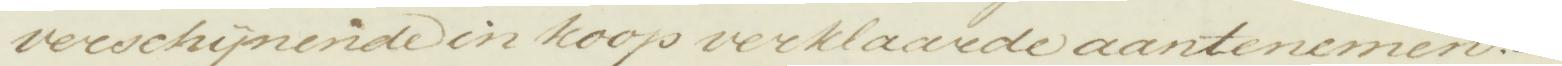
verschijnende in koop verklaarde aantenemen:—
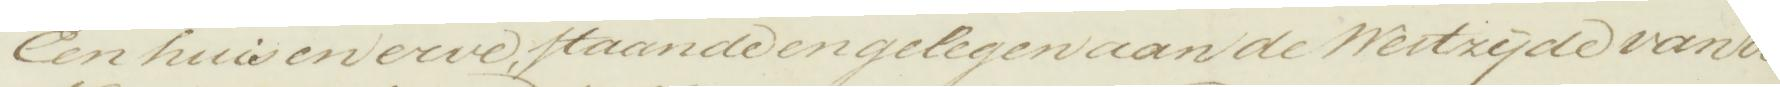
Een huis en erve, staande en gelegen aan de Westzijde van de
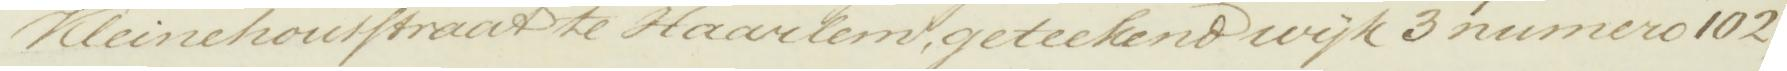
Kleinehoutstraat te Haarlem, geteekend wijk 3 numero 102,
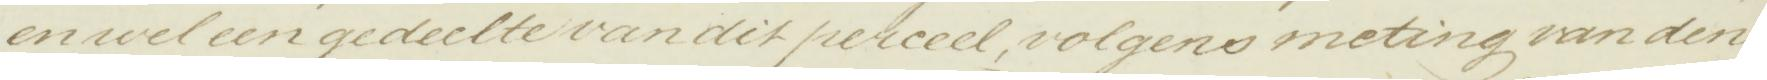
en wel een gedeelte van dit perceel, volgens meting van den
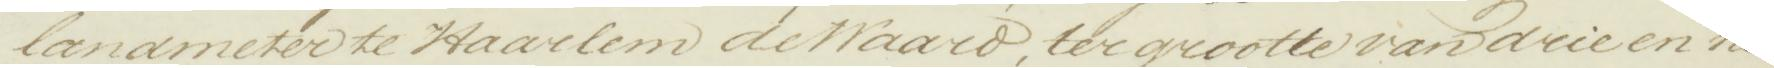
landmeter te Haarlem de Waard, ter grootte van drie en ne
